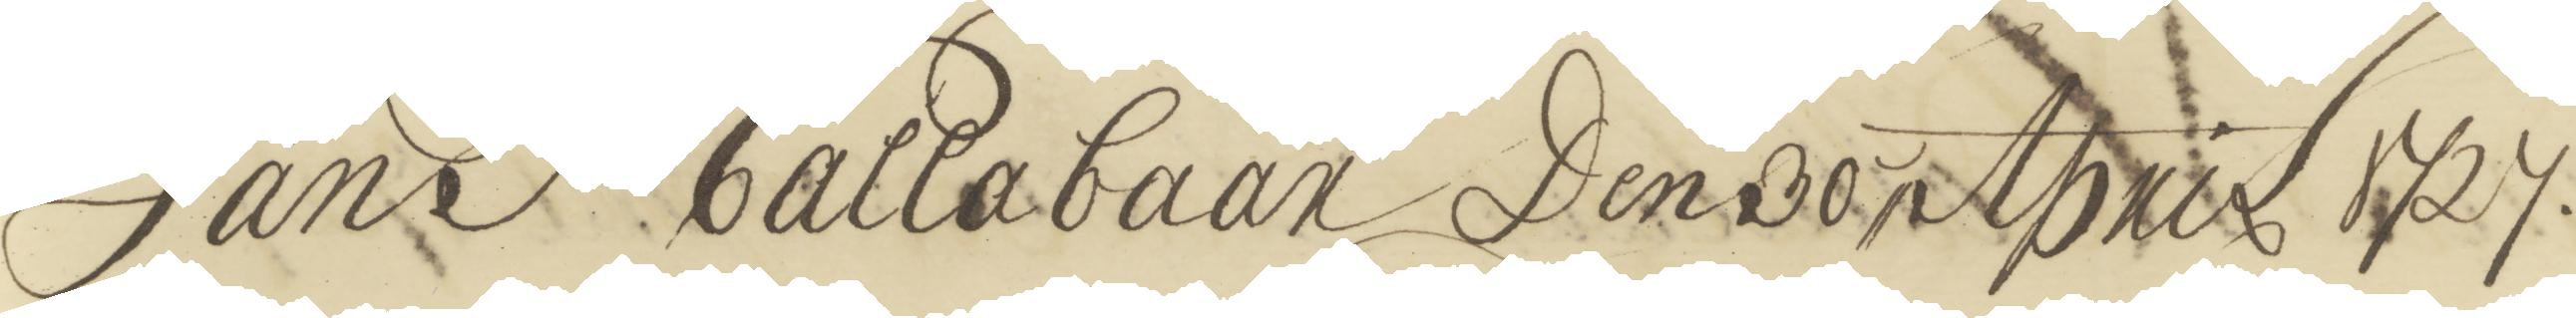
Van Mallabaar Den 30„' April 1727
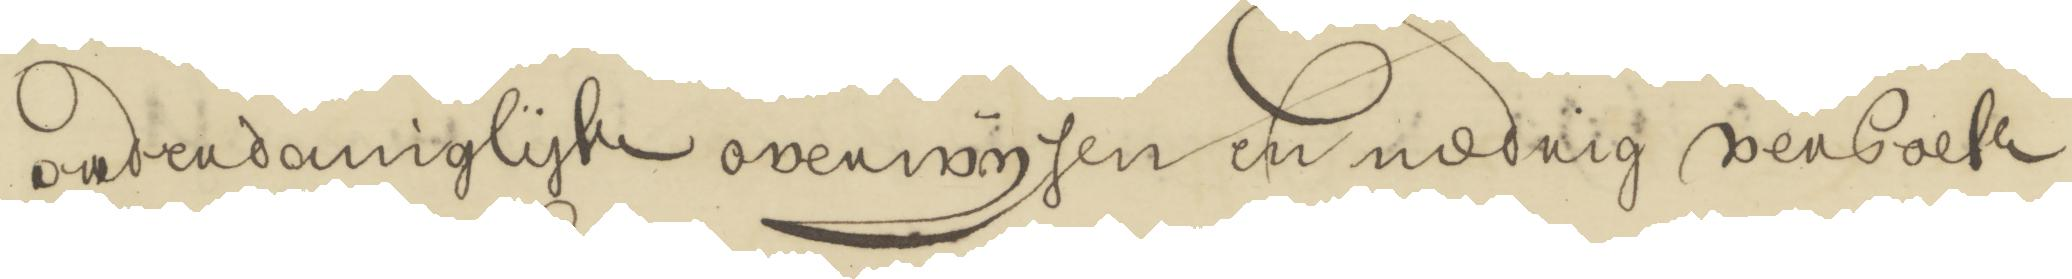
onderdaniglijk overwijsen en nedrig versoek
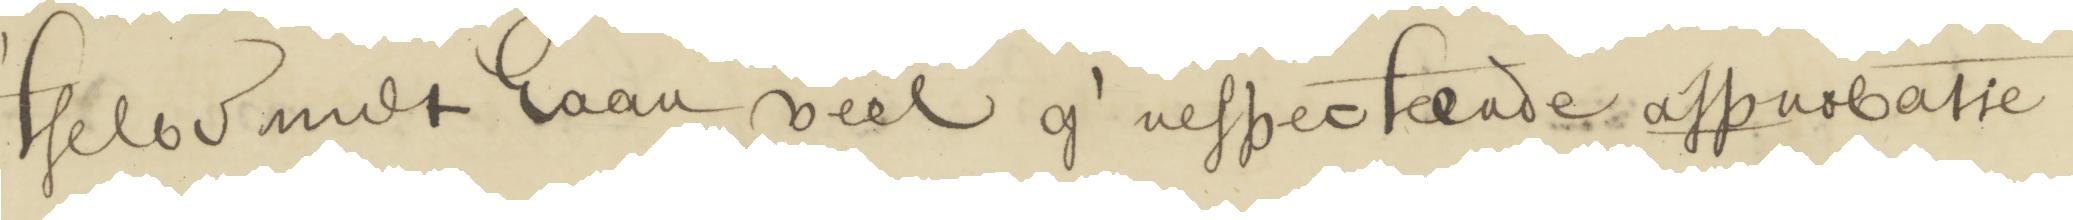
tselve met haar veel g’respecteerde approbatie
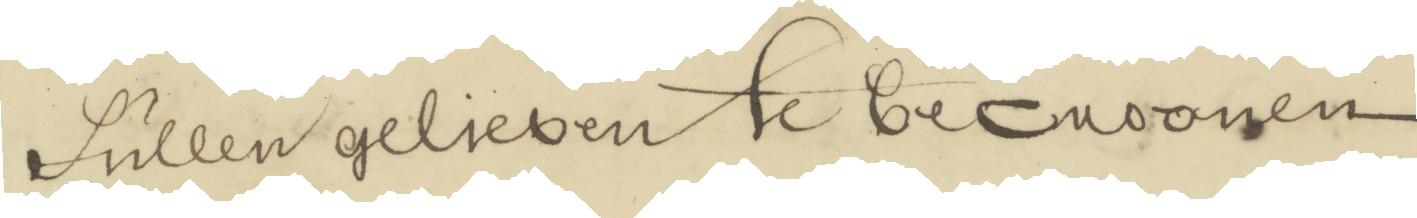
sullen gelieven te becroonen
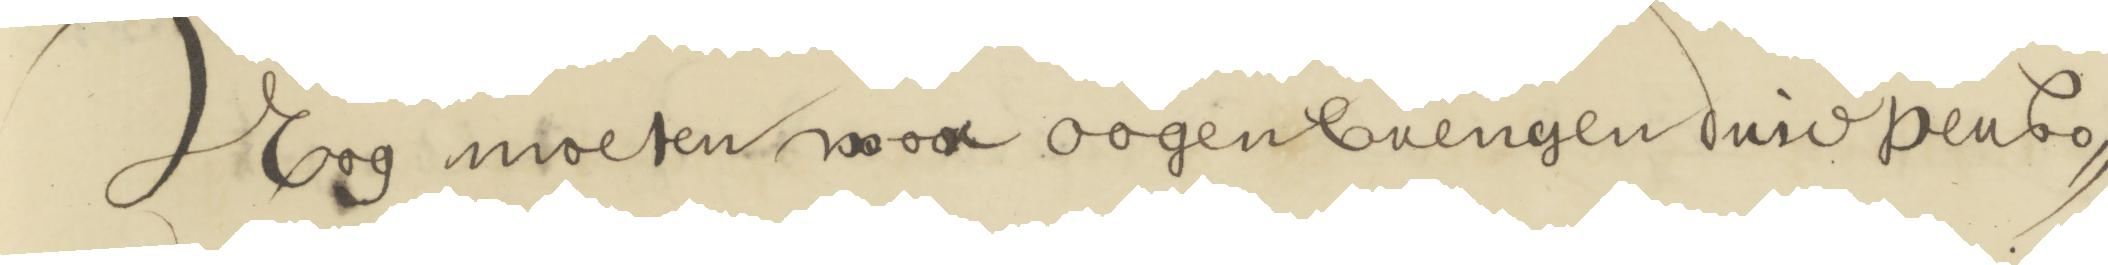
Nog moeten voor oogen brengen drie perso„
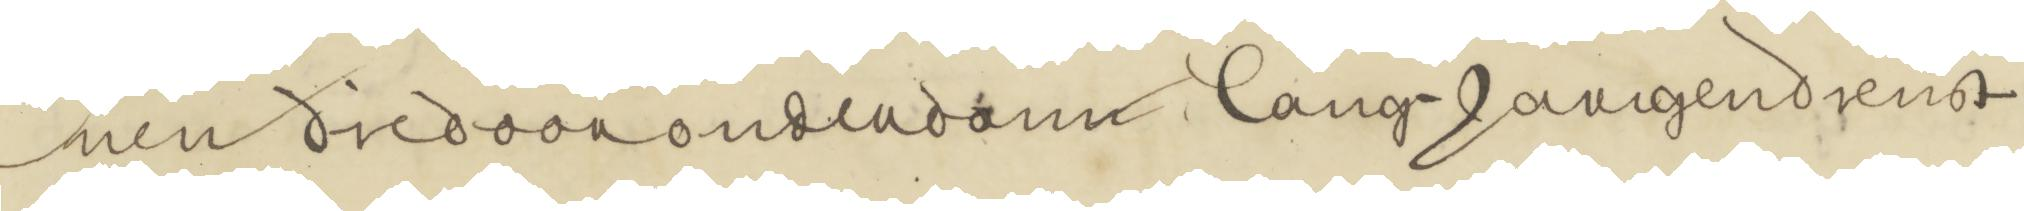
nen die door ouderdom lang jarigen dienst
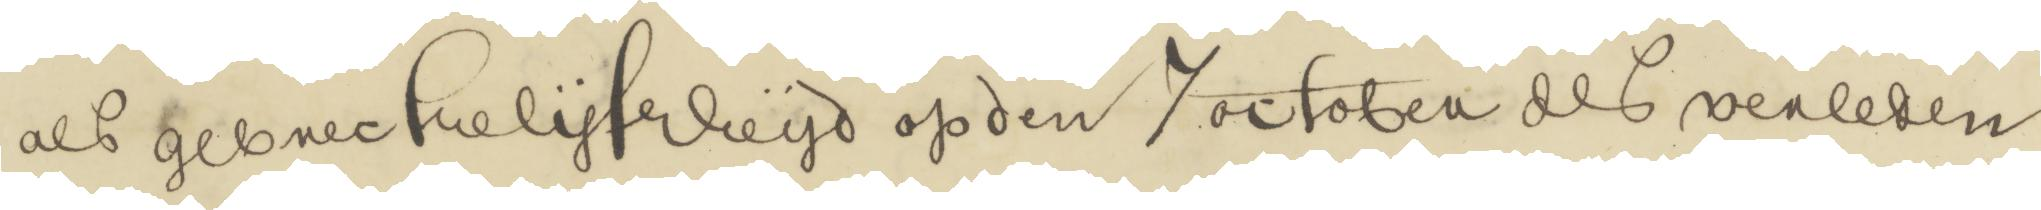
als gebreckelijkheijd op den 7 october des verleden
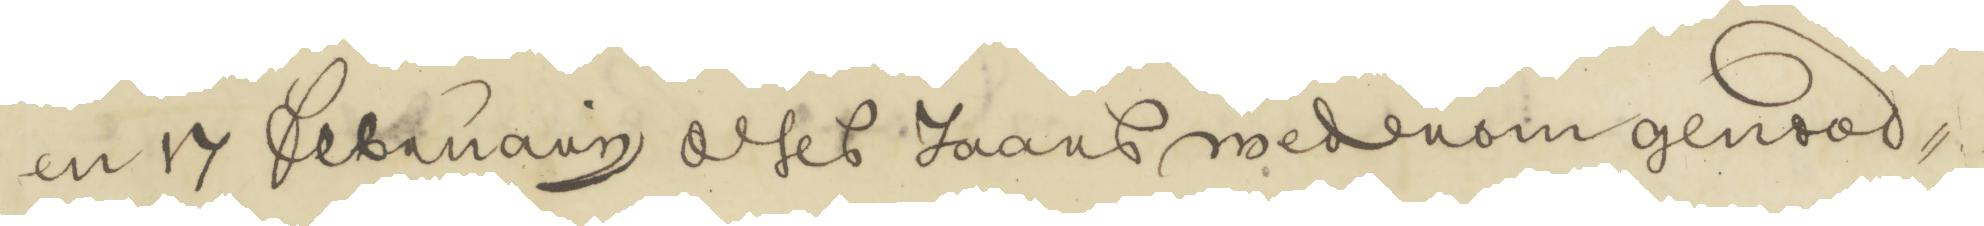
en 17 februarij deses Iaars wederom genood„
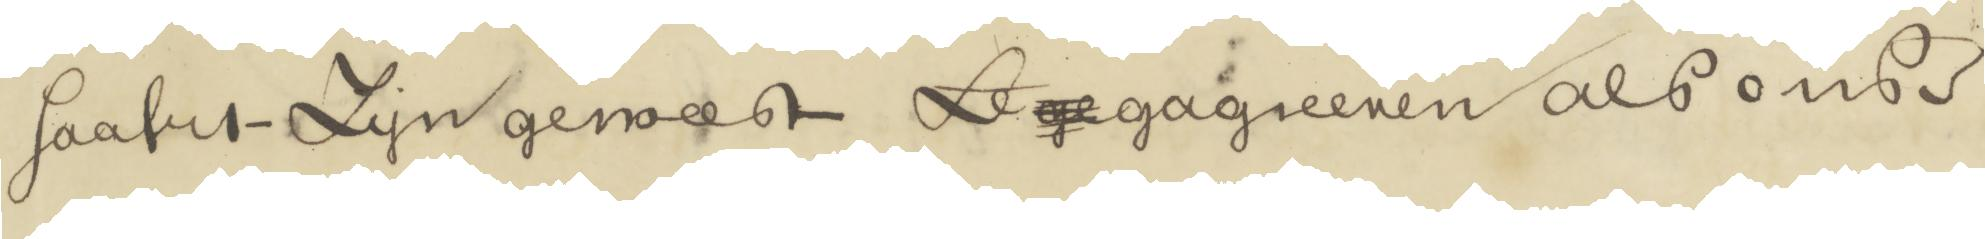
saakt zijn geweest te gegagieeren als onse
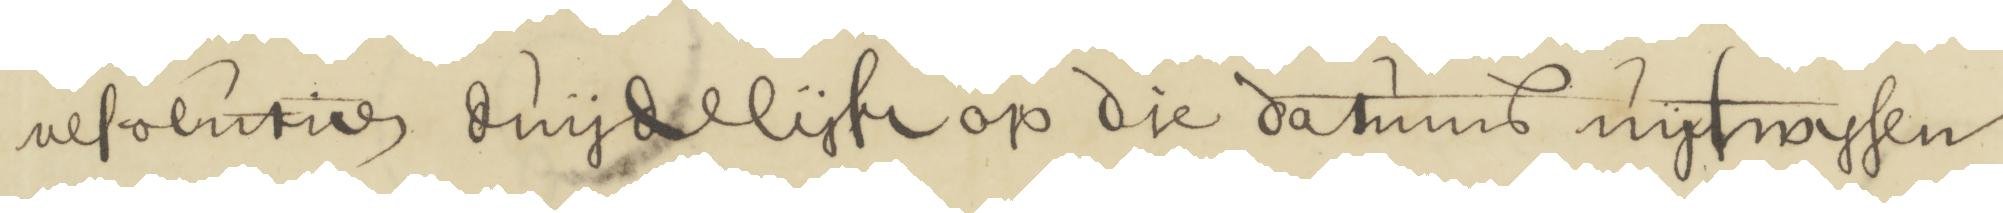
resolutien duijdelijk op die datums uijtwysen
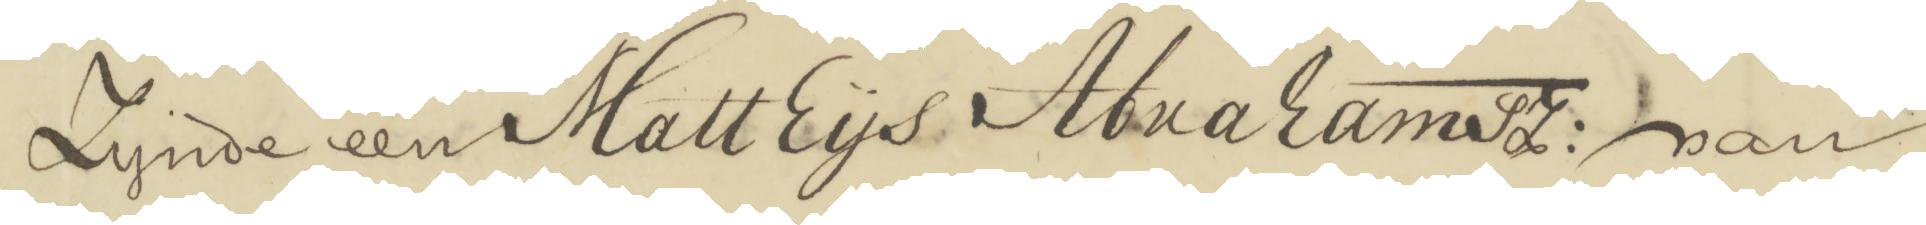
zijnde een Matthijs Abrahamsz: van
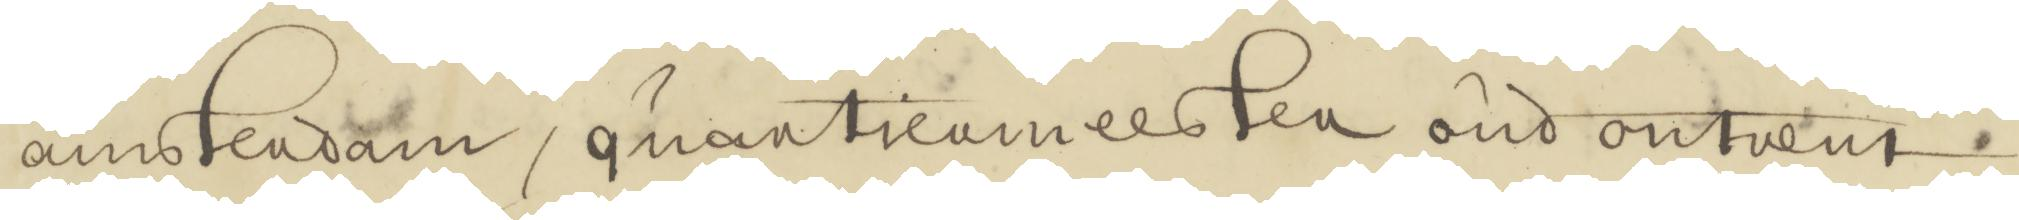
amsterdam, quartiermeester oud ontrent
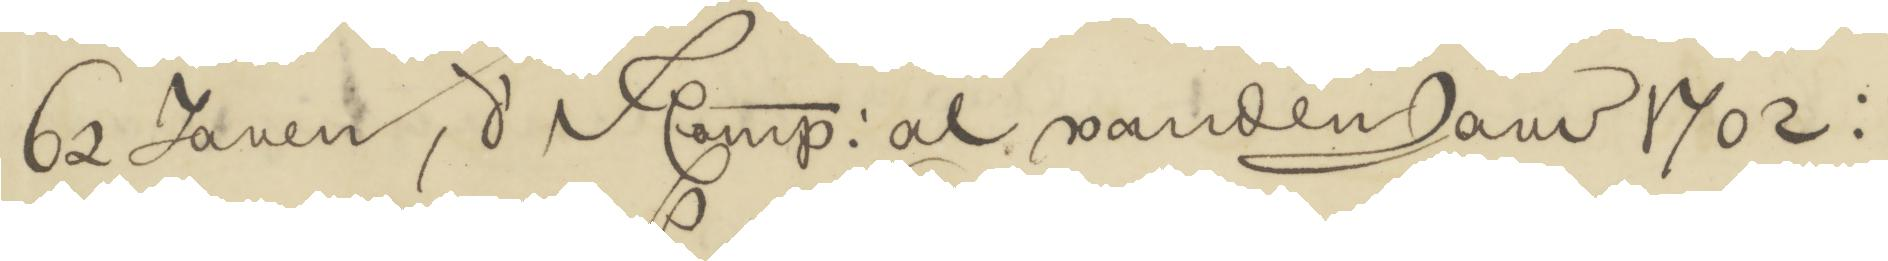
62 Iaren, d’ E Comp: al van den Jare 1702:
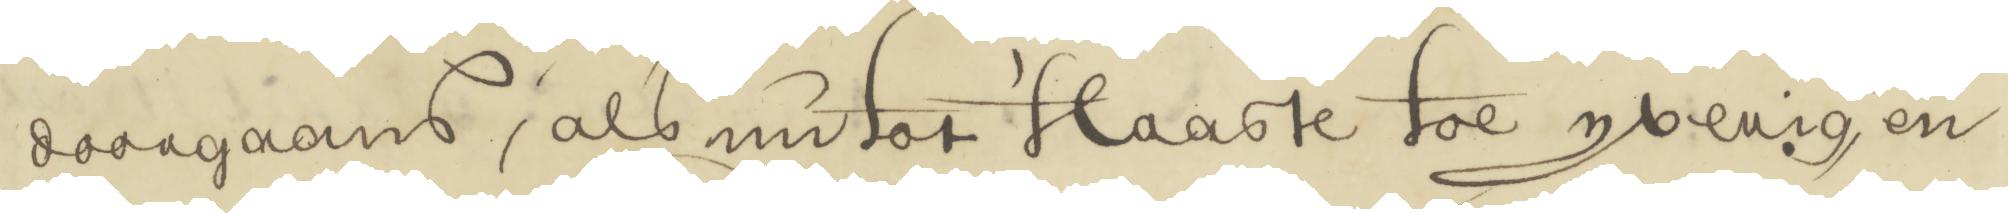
doorgaans, als nu tot 'tlaaste toe yverig, en
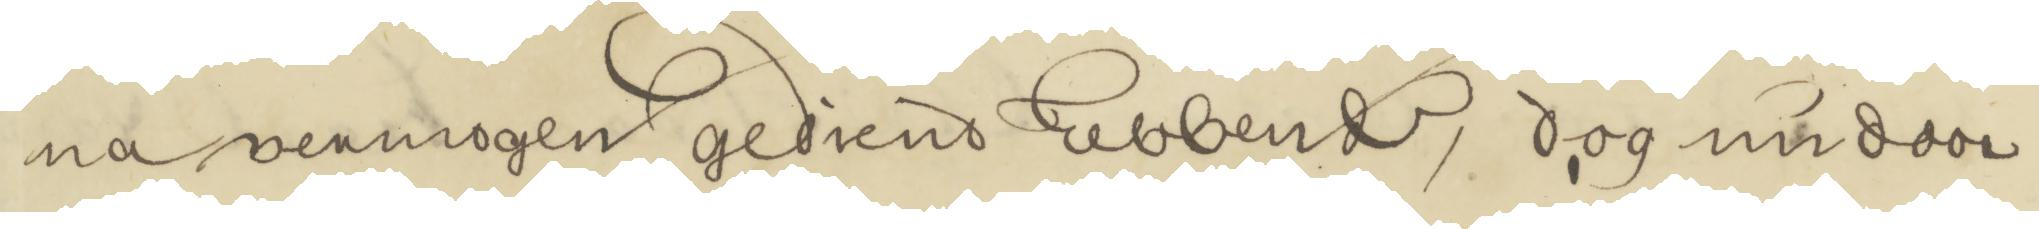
na vermogen gediend hebbende, dog nu door
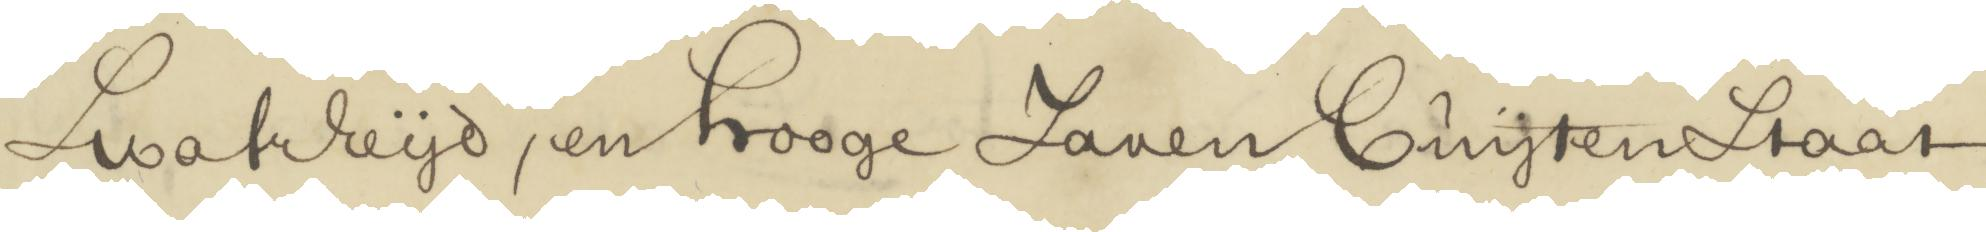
swakheijd, en hooge Iaren buijten staat
